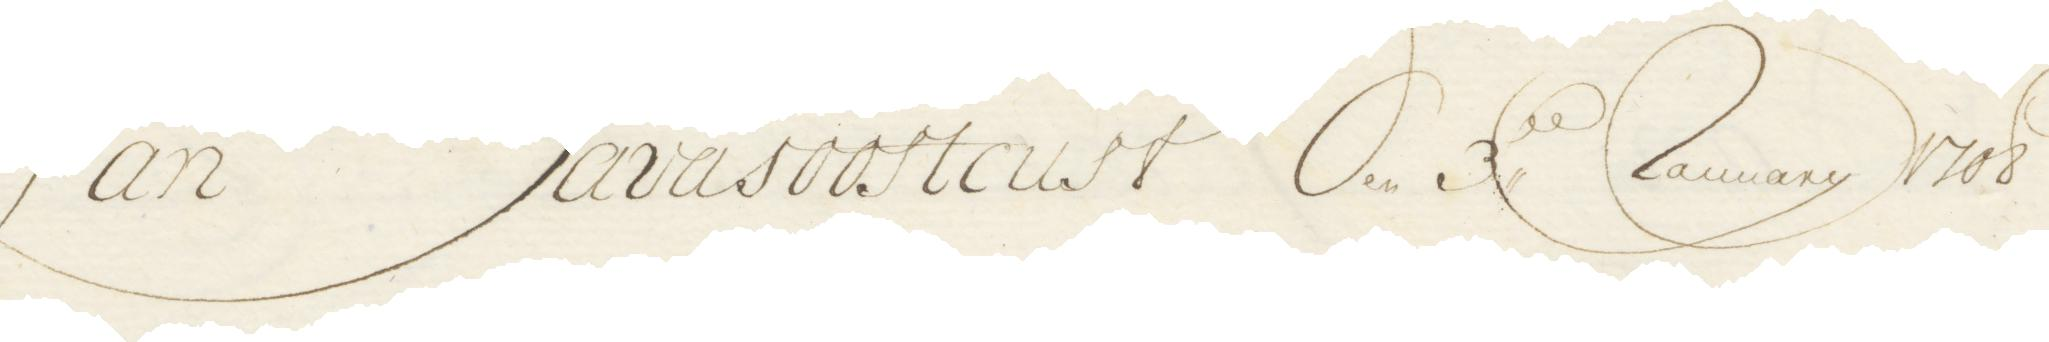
Van Javas oostcust Den 3„e Ianuary 1708
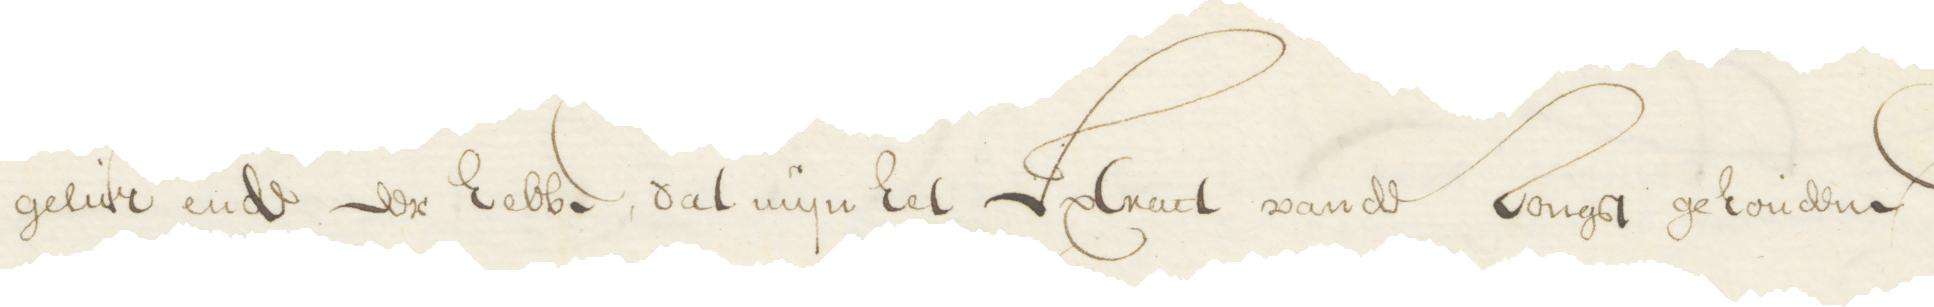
geluk ende eer hebbe, dat mijn het Extract vande Iongst gehoudene
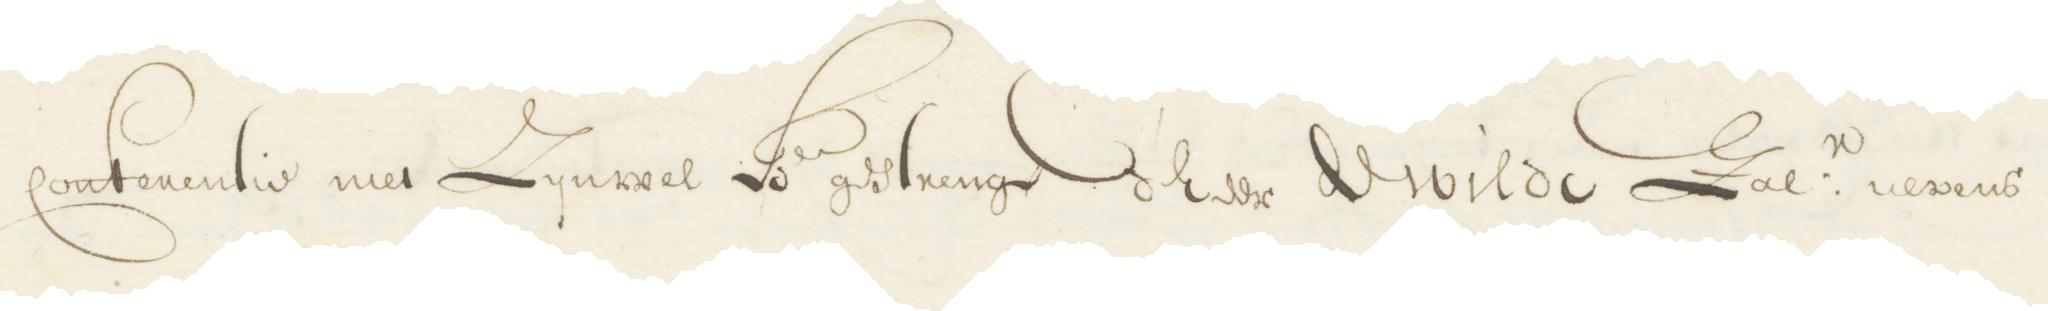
conferentie met Zyn wel Ed:le gestrenge d'heer de wilde Zal:r nevens
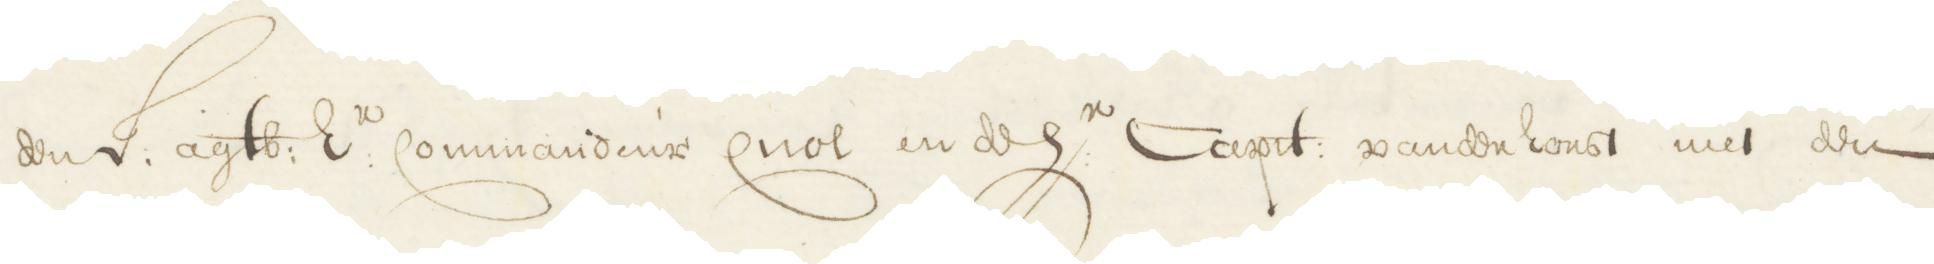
den E: agtb: h:r commandeur cnol en de h:r Capit: vander horst met den
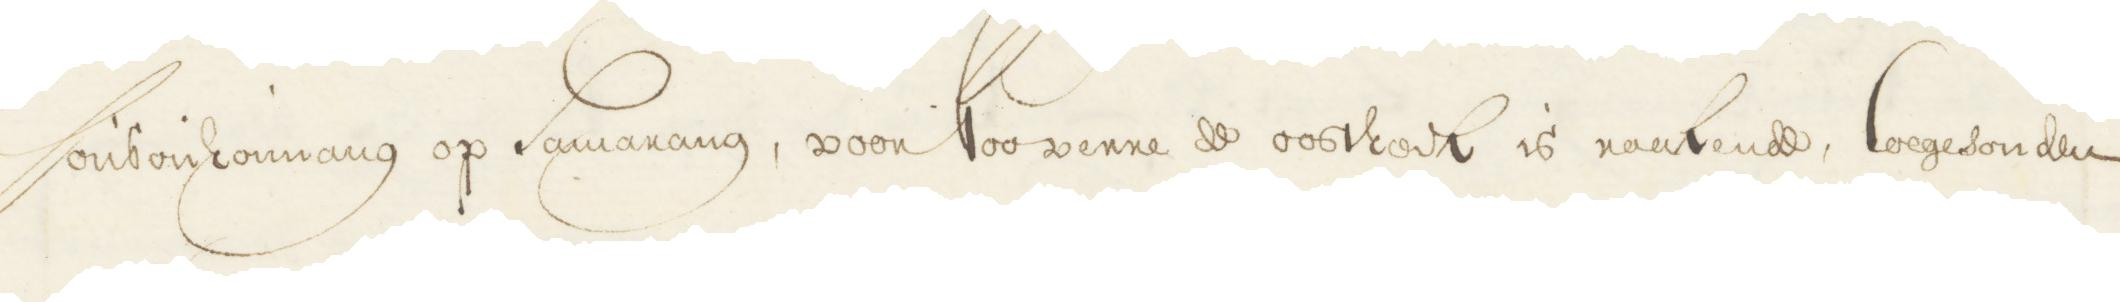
Sousouhounang op Samarang, voor Sooverre de oosthoek is raakende, toegesonden
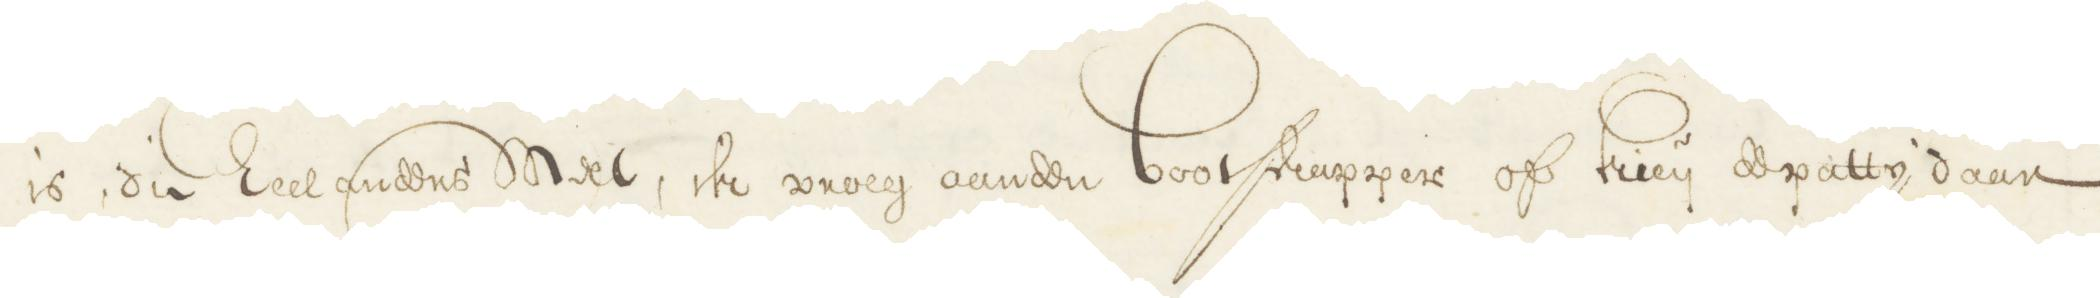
is, die heel anders melt, ik vroeg aanden bootschapper of kieij depattij daar
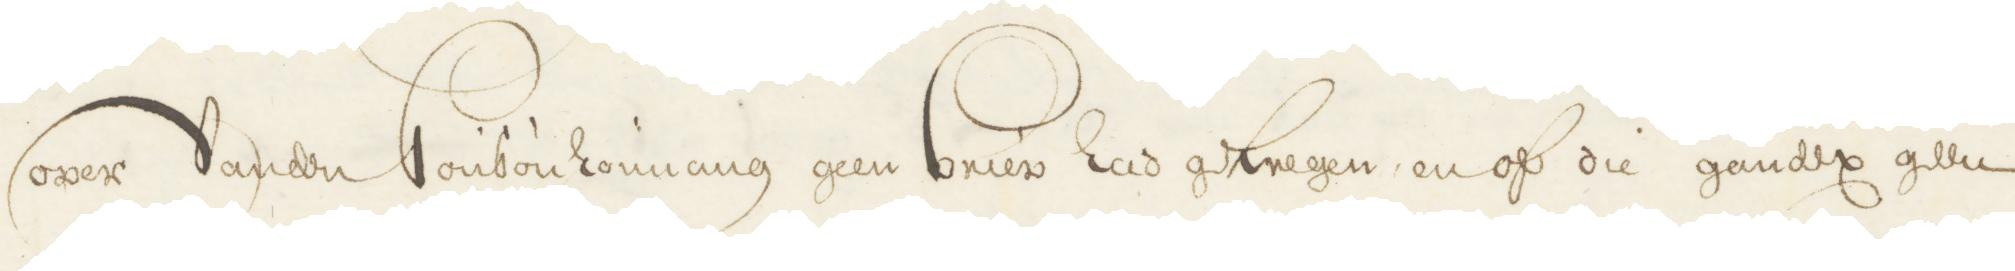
over vanden Sousouhounang geen briev had gekregen, en of die gandex geen
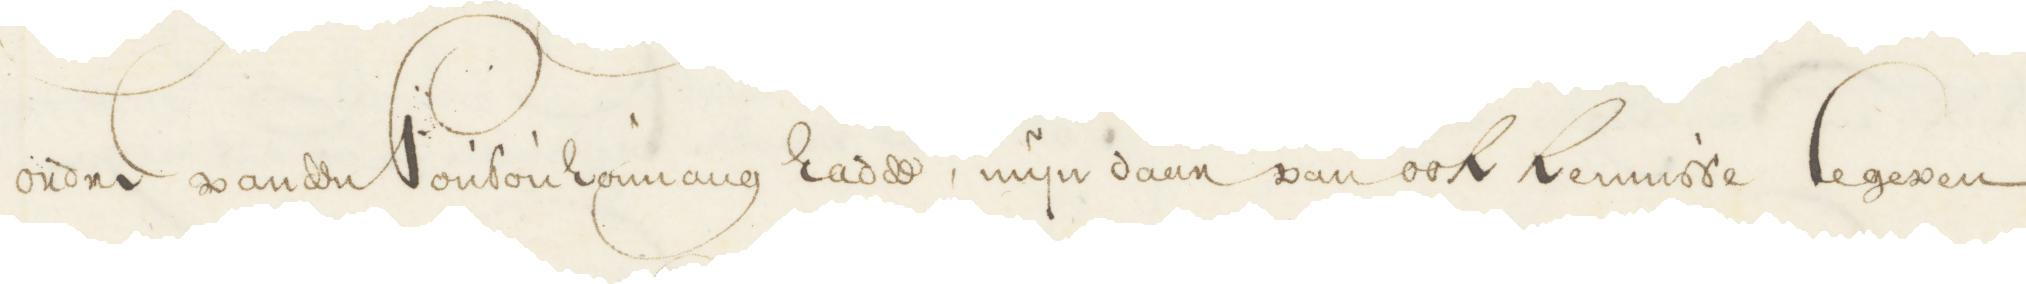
ordre vanden Sousouhounang hadde, mijn daar van ook kennisse te geven
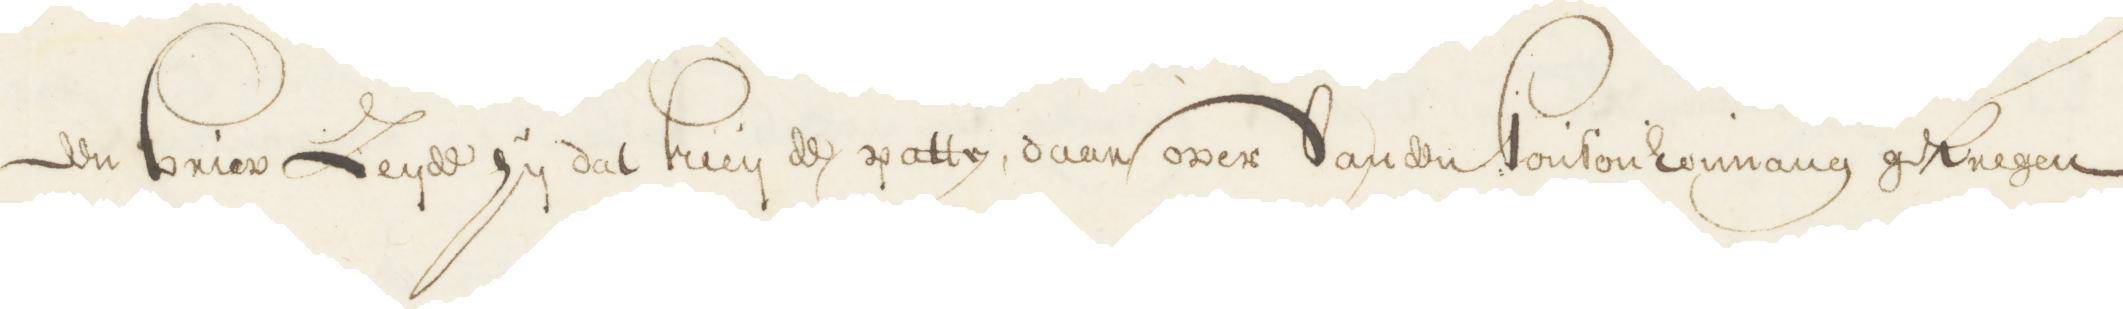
een briev Zeyde hij dat kieij de pattij, daar over Van den Sousouhounang gekregen
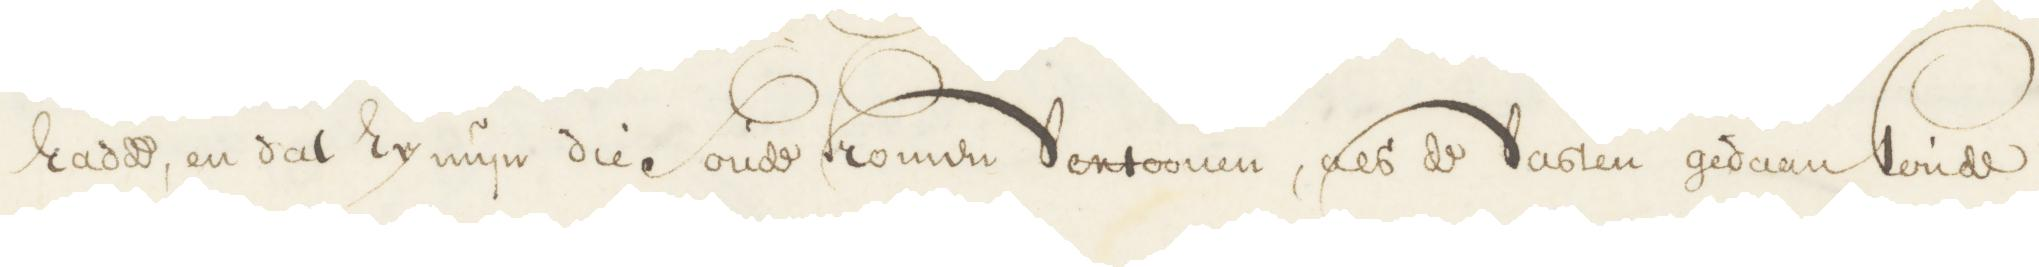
hadde, en dat hy mijn die Soude konnen vertoonen, als de vasten gedaan Soude
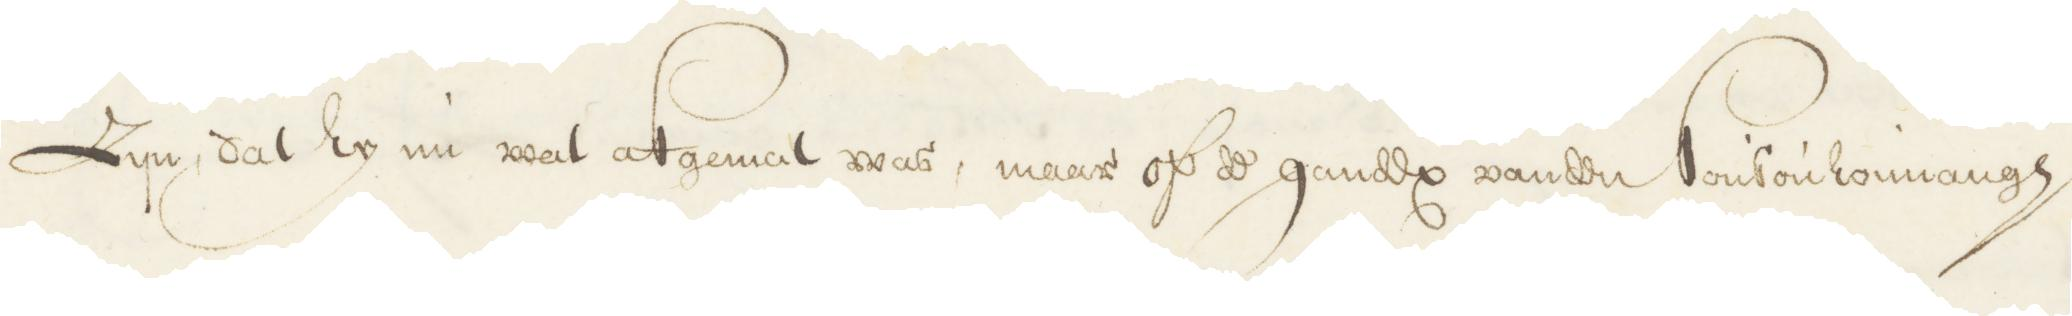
Zyn, dat hy nu wat afgemat was, maar of de gandex van den Sousouhounangh
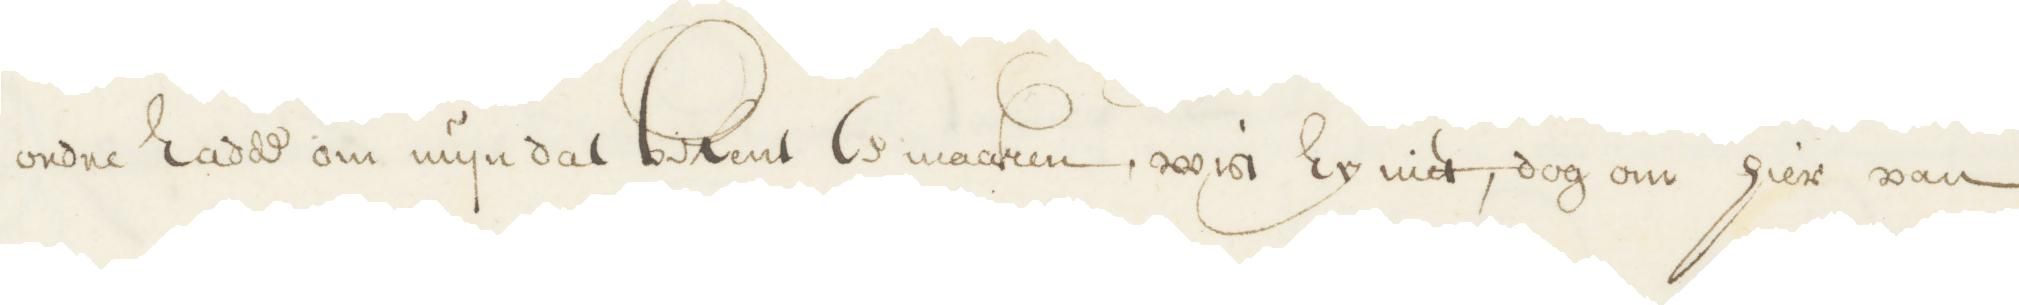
ordre hadde om mijn dat bekent te maaken, wist hy niet, dog om hier van
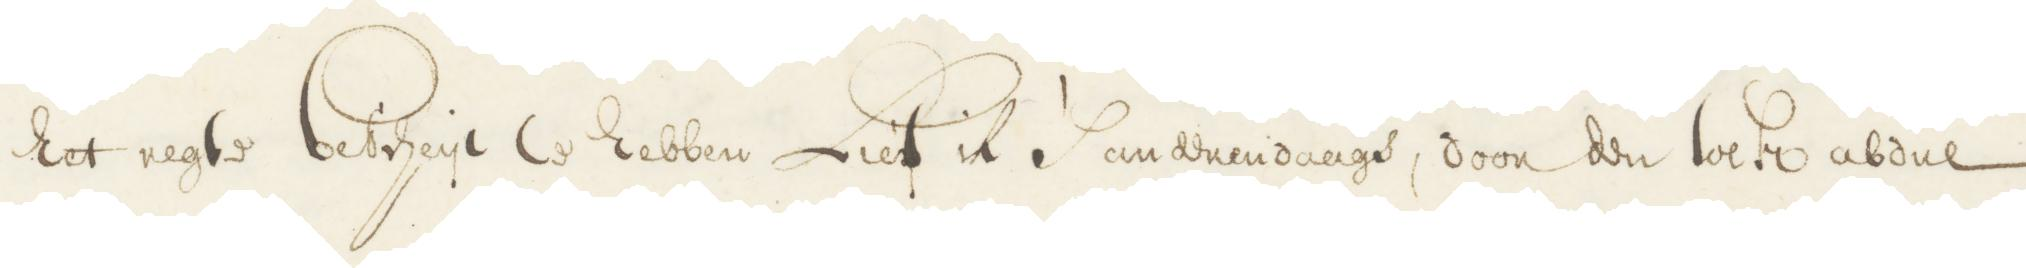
het regte bescheijt te hebben Liet ik 'S anderendaags, door den toek abdul
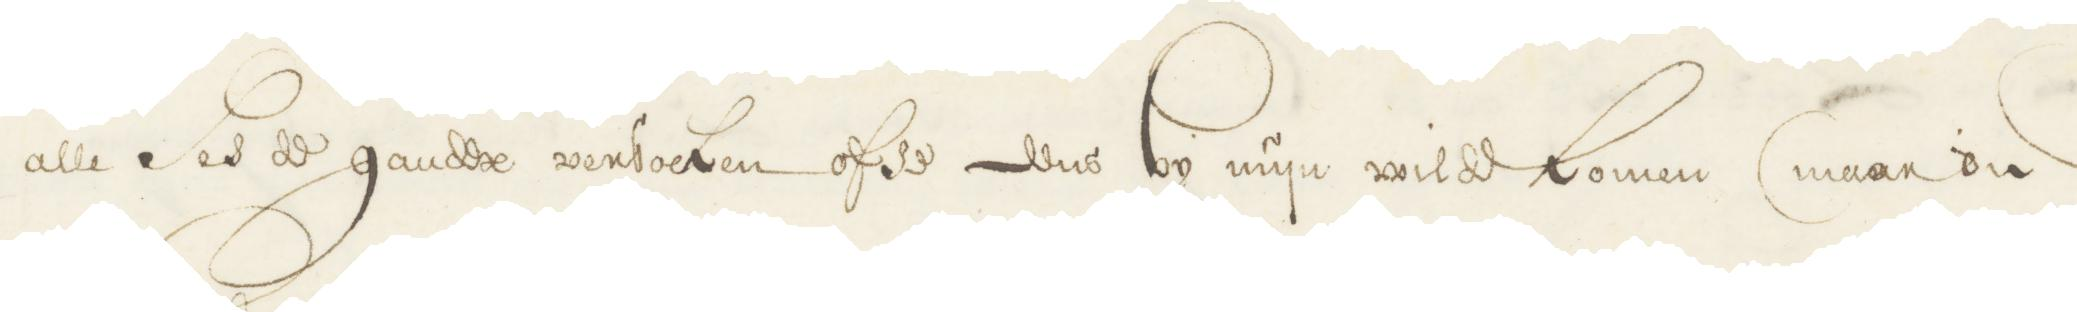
alle ses de gandex versoeken of se eens bij mijn wilde komen (maar die
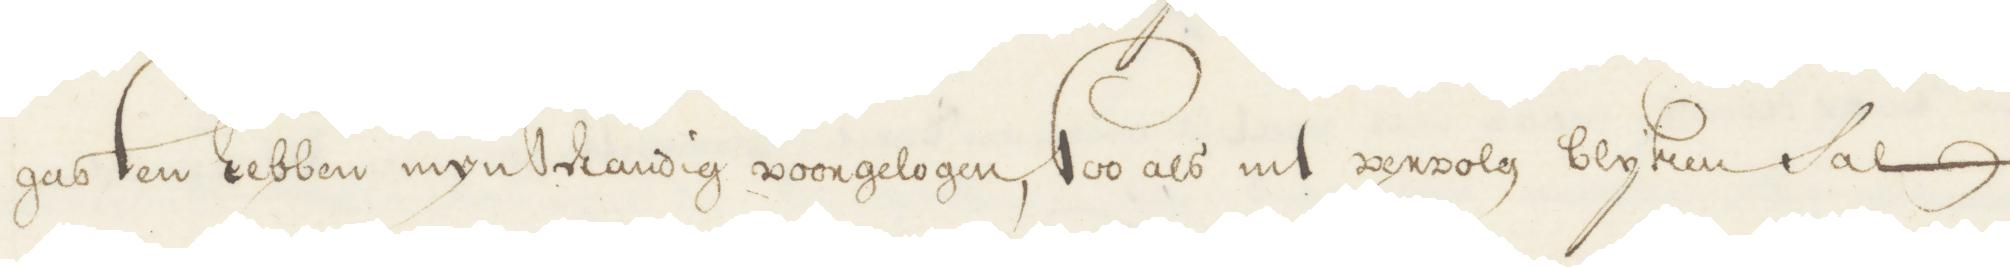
gasten hebben myn schandig voorgelogen, Soo als int vervolg blijken Sal)
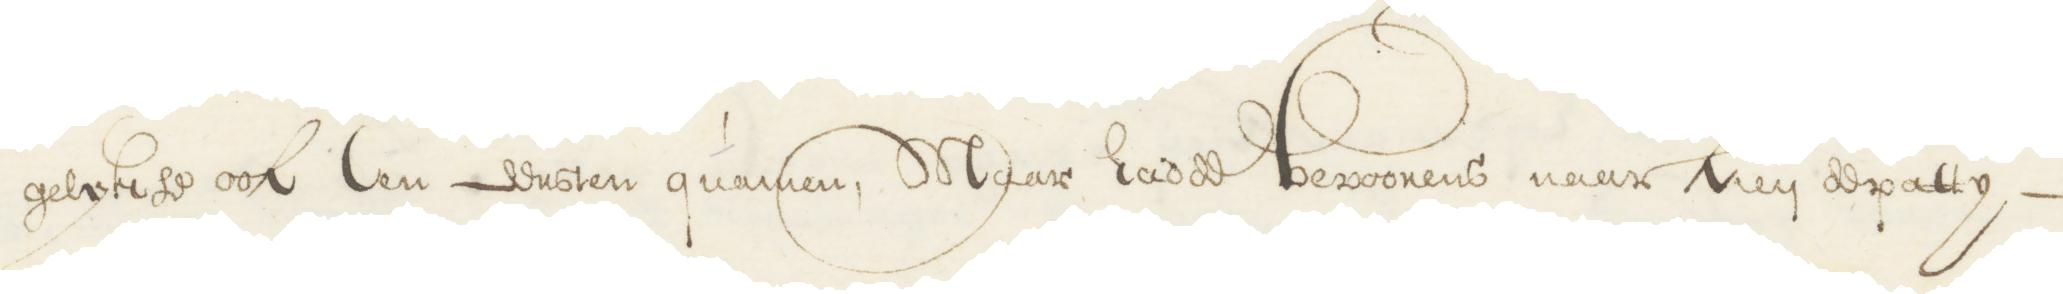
gelyk se ook ten eersten quamen, Maar hadde bevoorens naar kieij depattij —
